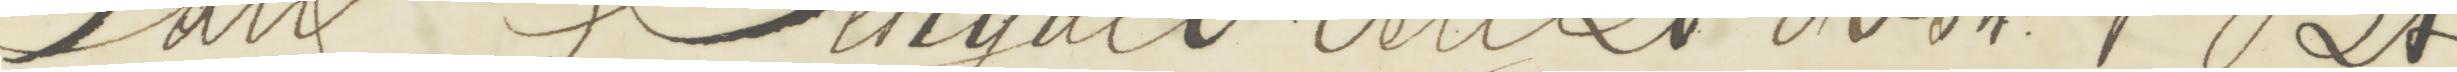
Van Bengale den 20' 8ber. 1721
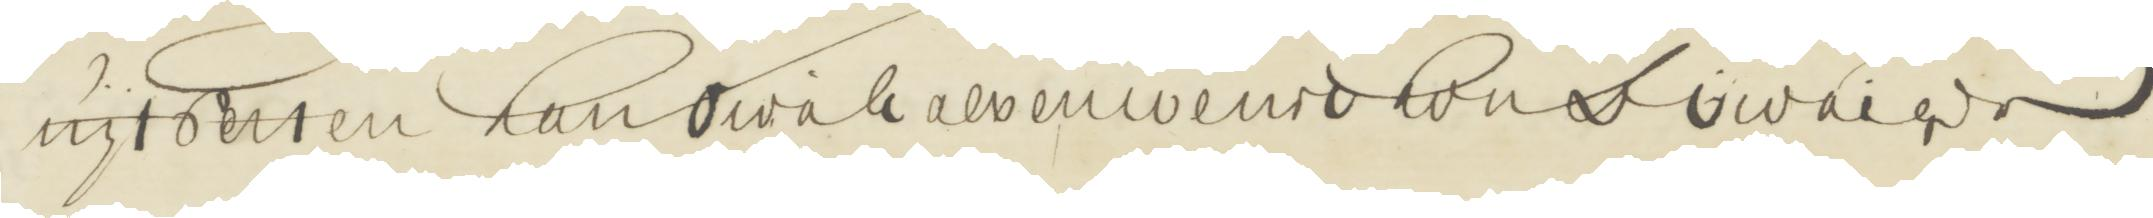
uijtsetten kan dierhalven wenschen sweriger
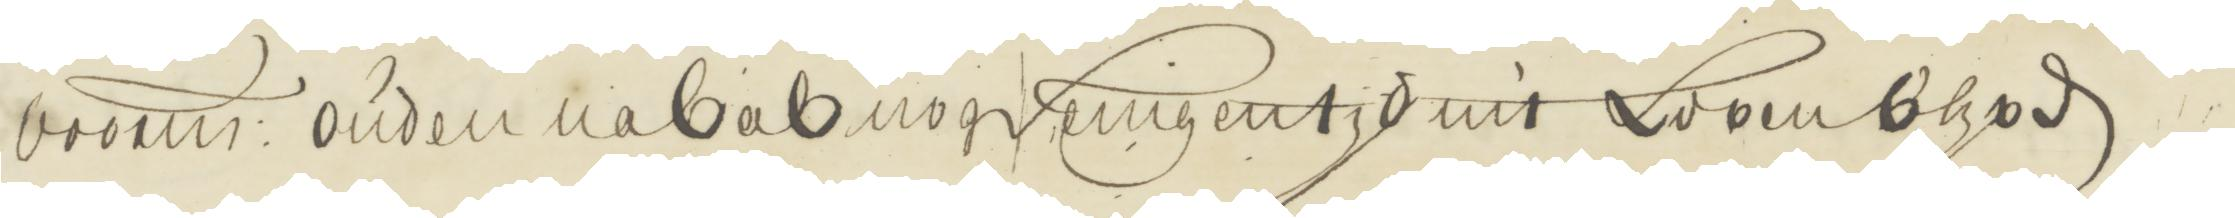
voorm: ouden nabab nog Eenigen tijd in 't Leven blyven
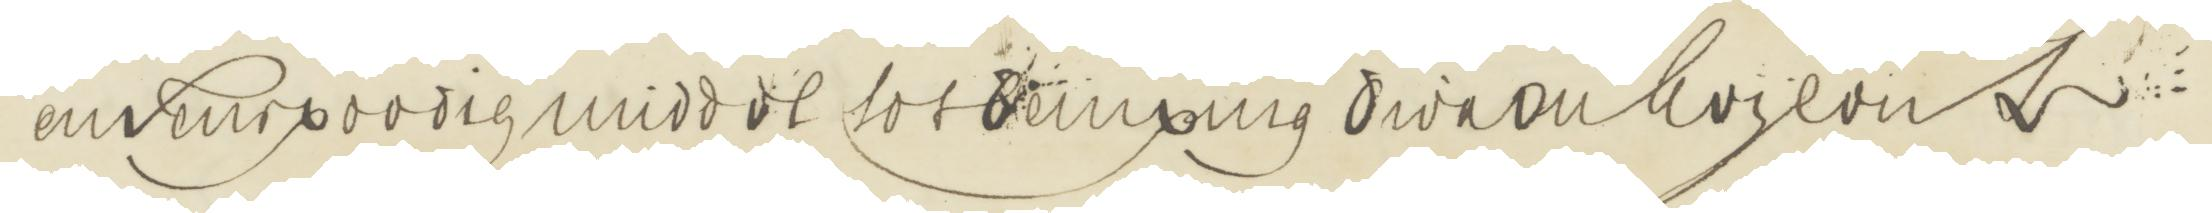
en Een spoodig middel tot demping dier onheijlen te
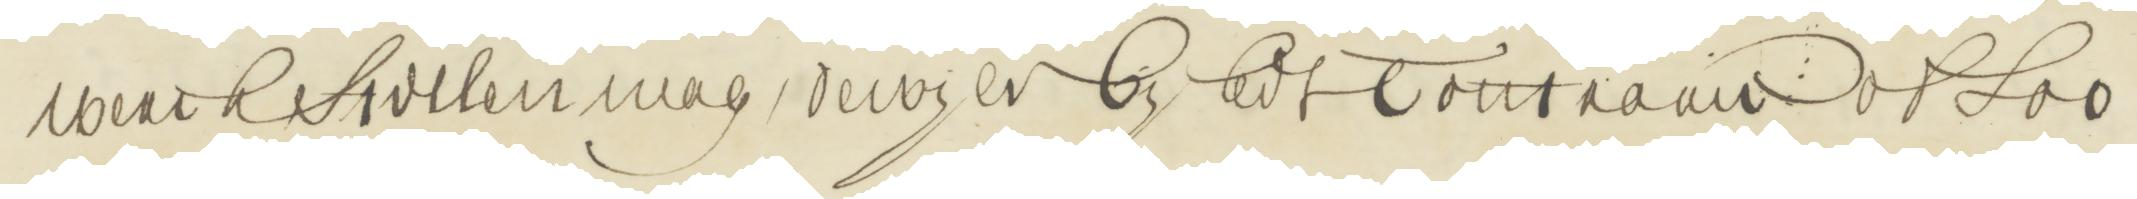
werck stellen mag, dewijle bij het Contrarie of soo
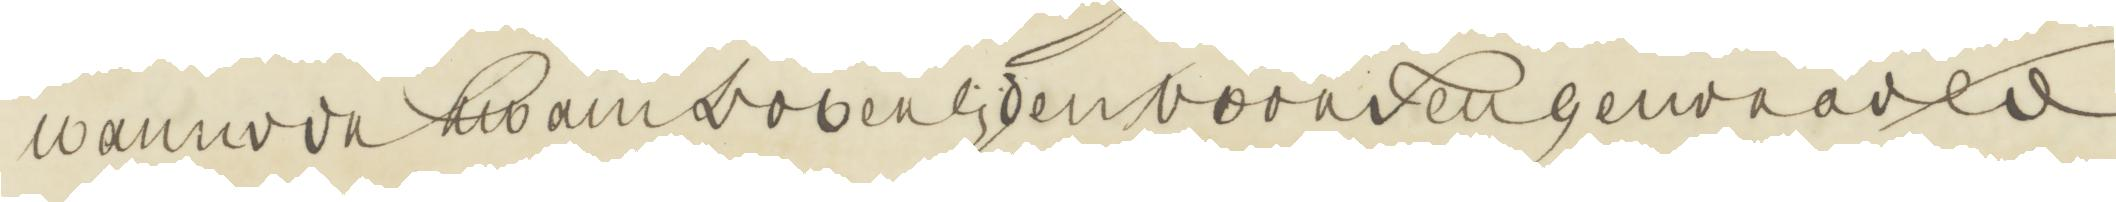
wanneer kwam te overlijden voor Een generaele
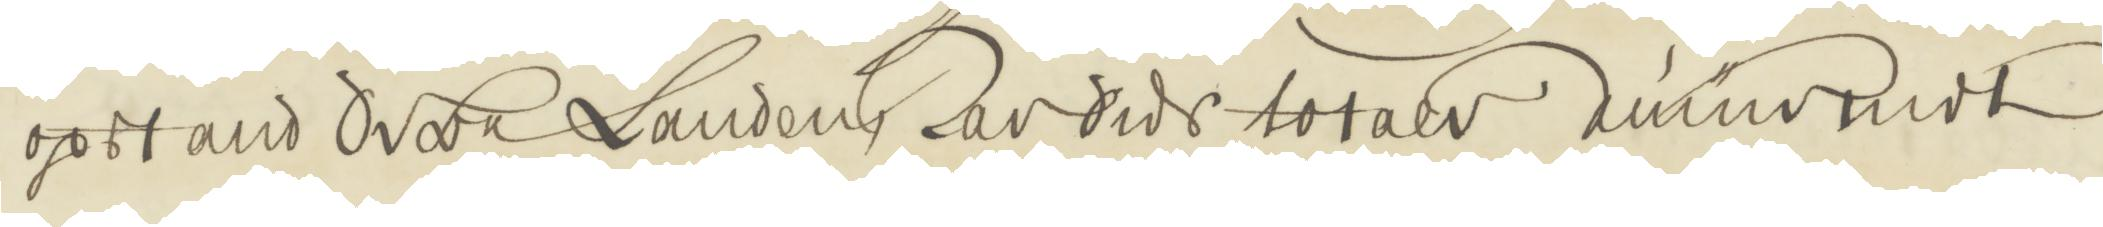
opstand deser Landen, Iae dies totale duure met
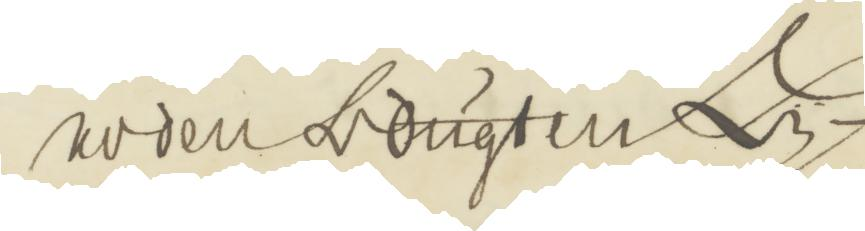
reden te dugten Zij —
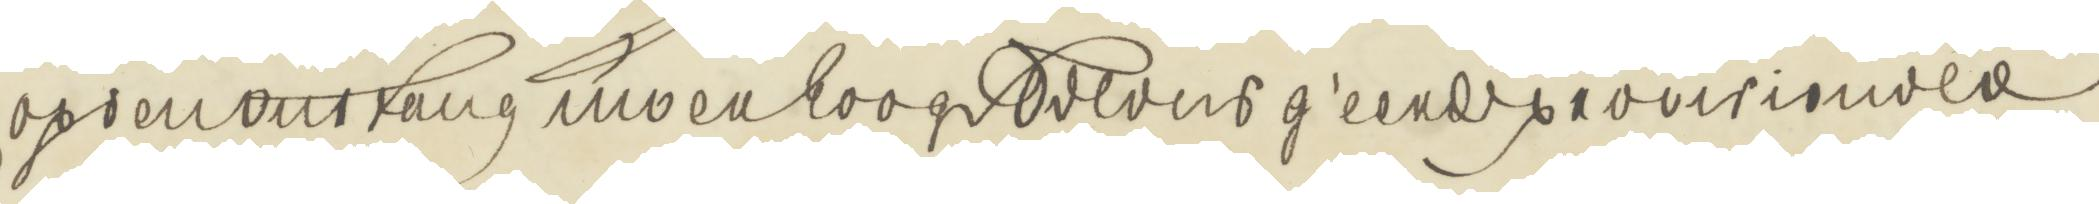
op den ontfang uwer hoog Edelens g’eerde provisionele
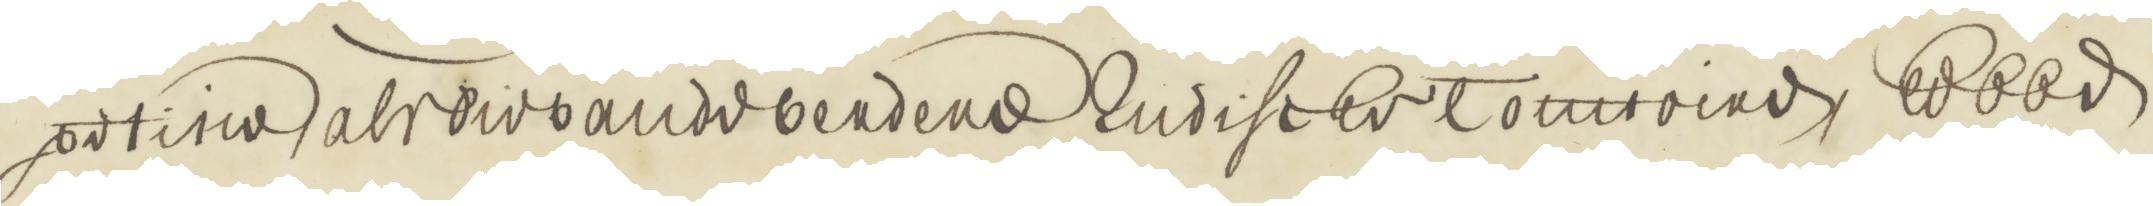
petitie, als die van de verdere Indische Comtoiren, hebben
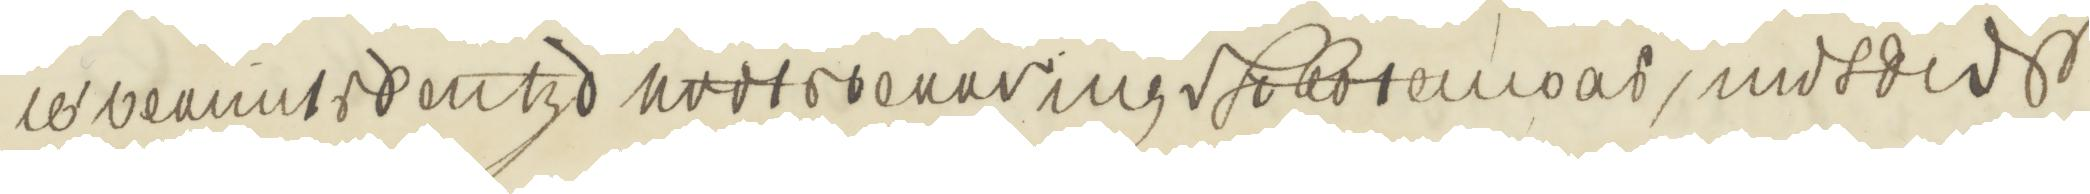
w' vermits den tyd reets verre ingeschoten was, met desen
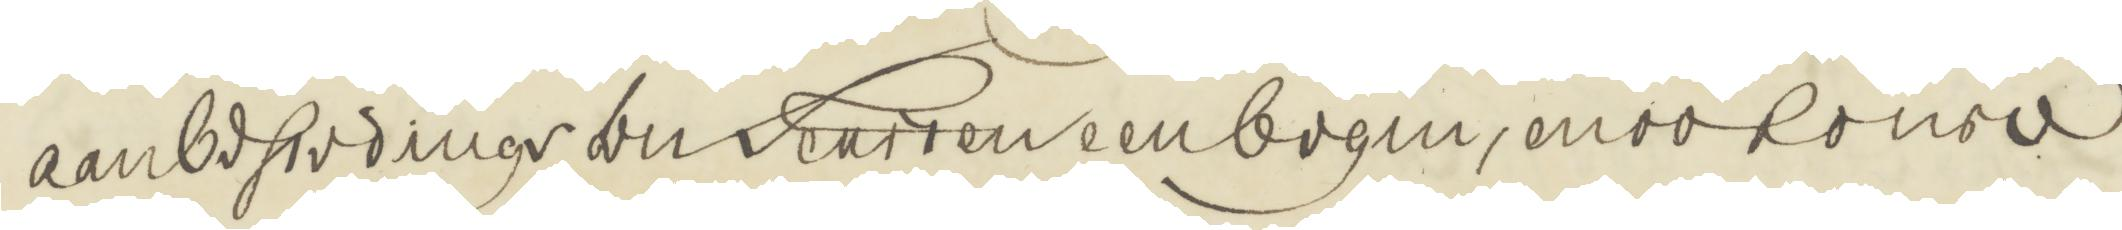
aanbestedinge ten Eersten een begin, en ook onse
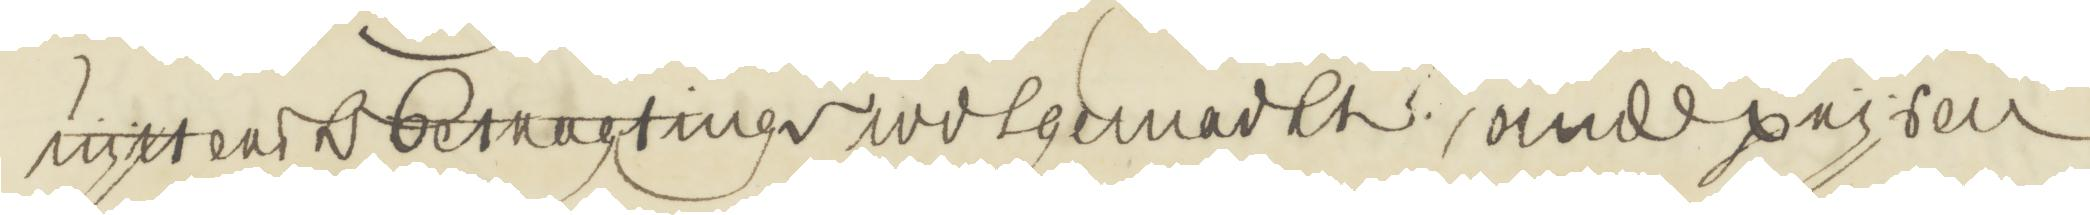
uijtterste betragtinge wel gemaekt, omde prijsen
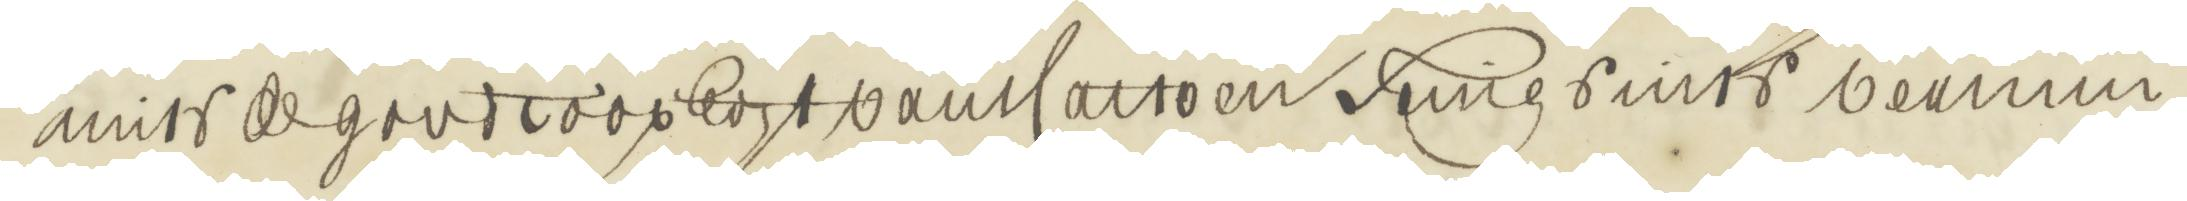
mits de goedcoopheyt van 't Cattoen Eenigsints vermin
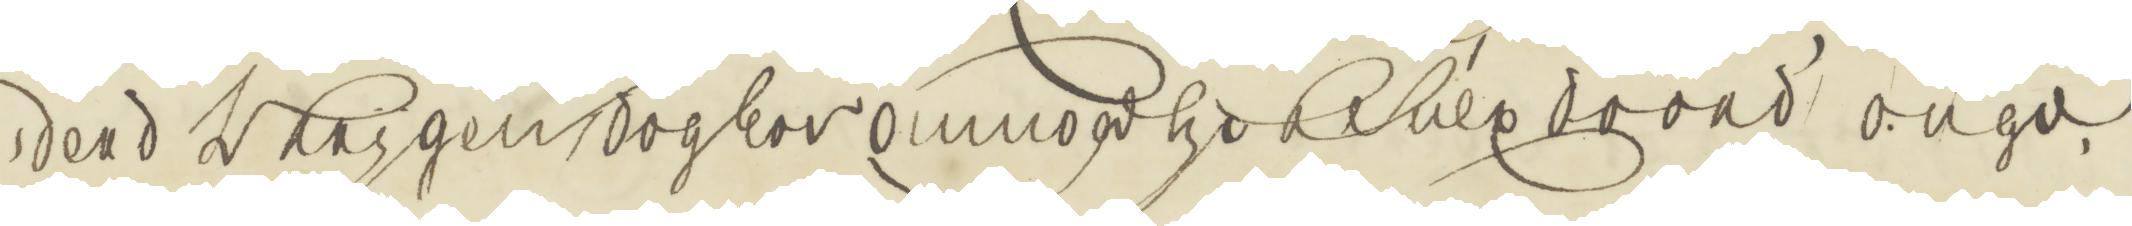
„derd te krijgen, dog hoe onmogelyck sulx door d’onge
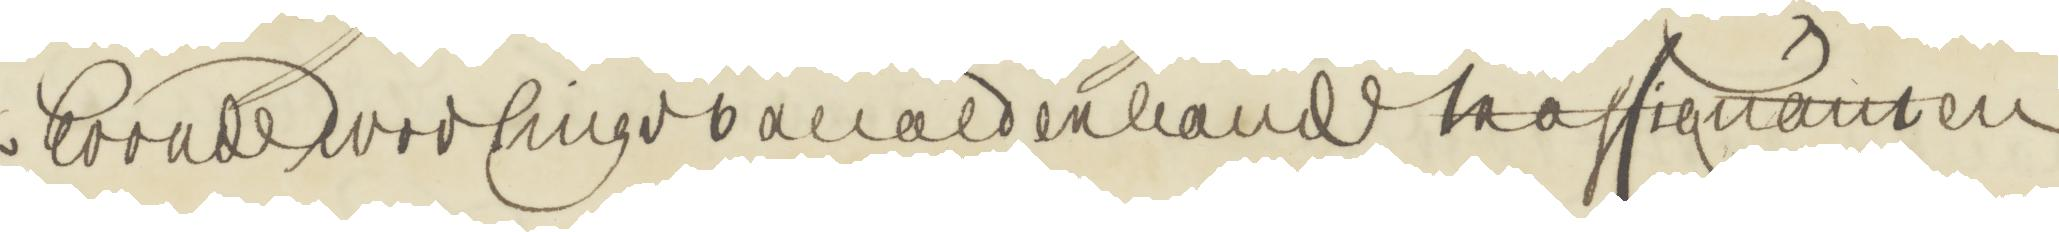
hoorde woelinge van alderhande traffiquanten
